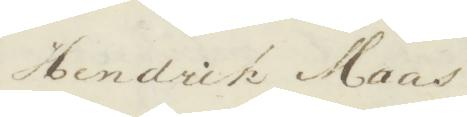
Hendrik Maas
